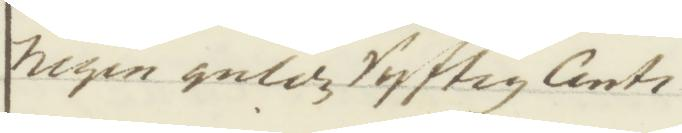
negen gulden Vyftig Cents
